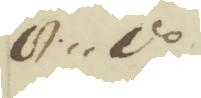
8 „ do
